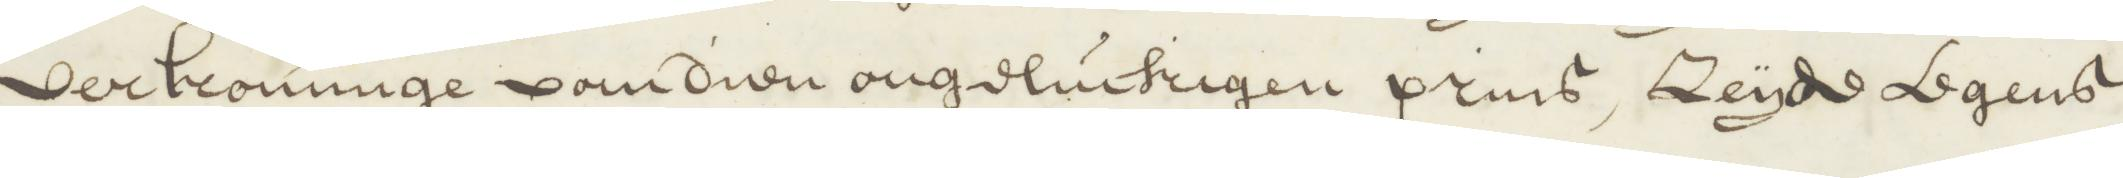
verkonninge van dien ongeluckigen prins, zeijde tegens
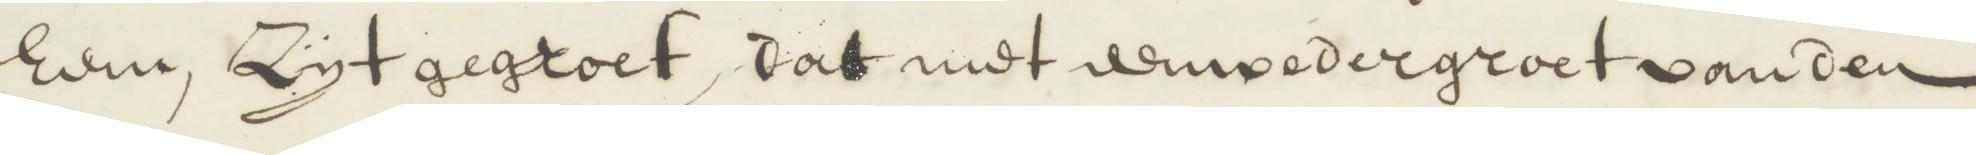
hem, Zijt gegroet, dat met eenwedergroet van den
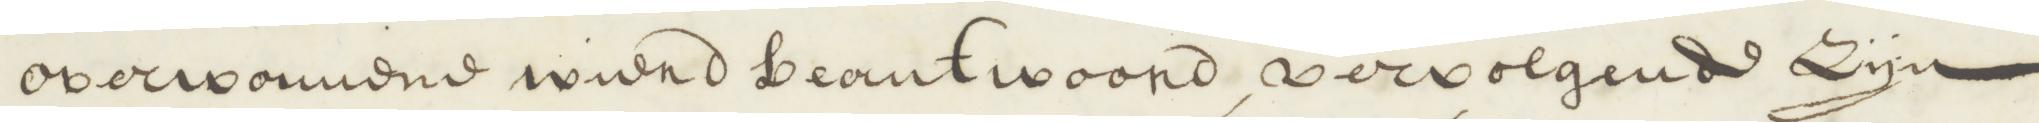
overwonene wierd beantwoord, vervolgende zijn
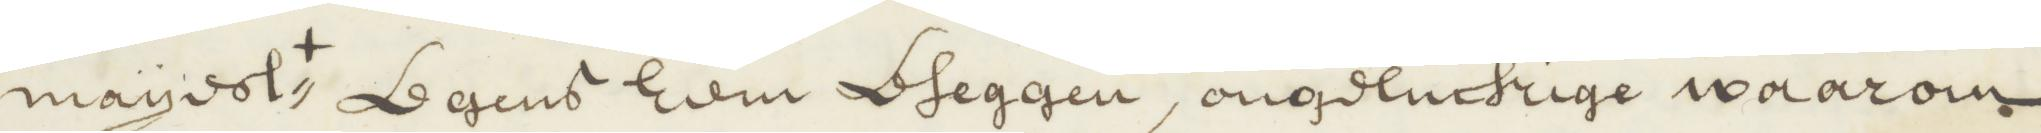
maijest„t tegens hem teseggen, ongeluckige waarom
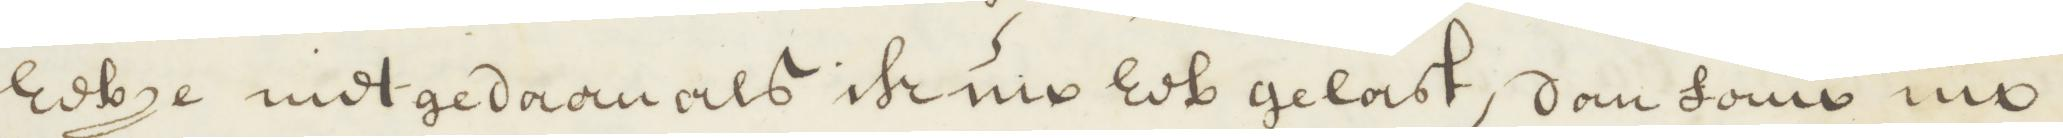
hebje niet gedaan als ik uw heb gelast, dan souw uw
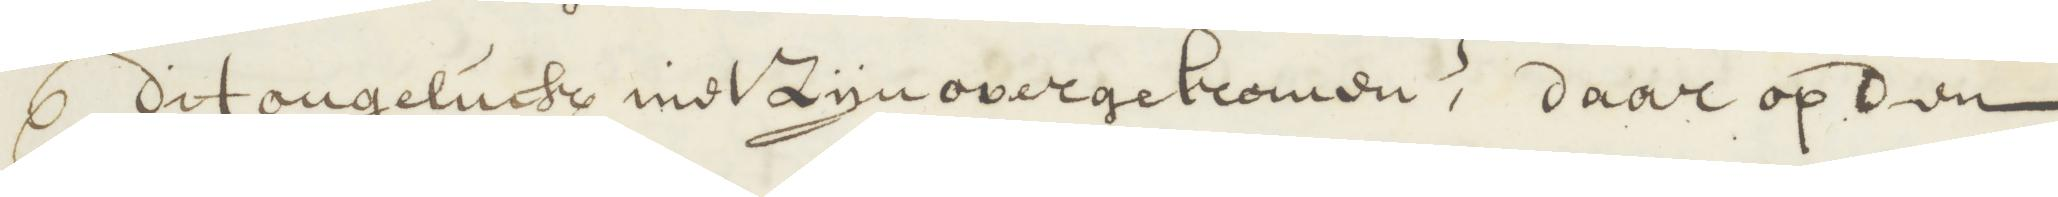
dit ongeluck niet zijn overgekomen; daar op den
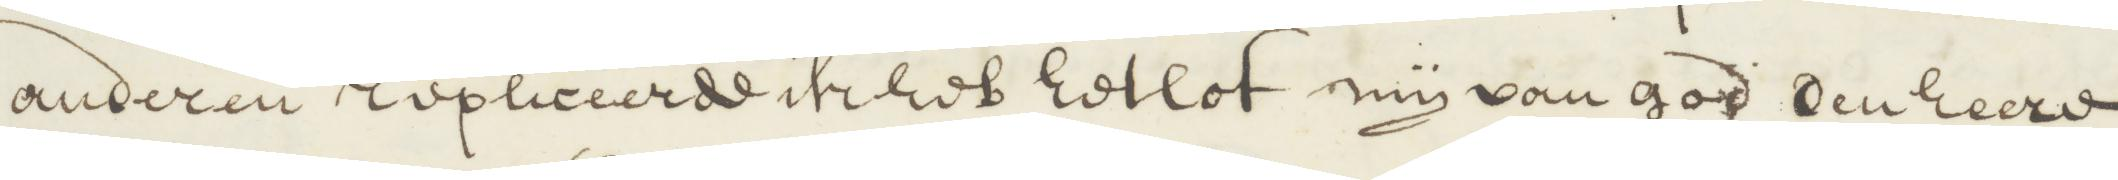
anderen repliceerde ik heb het lot mij van god den heere
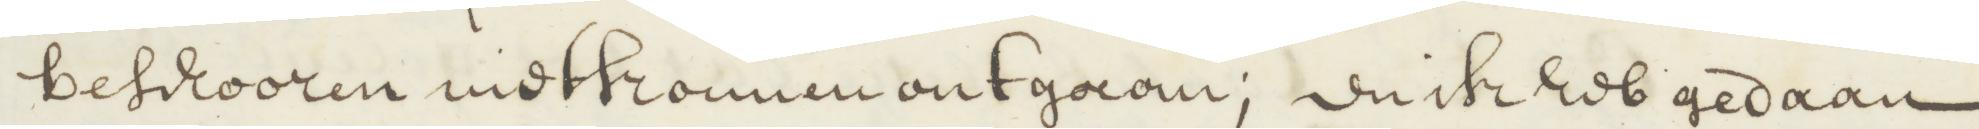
beschooren niet konnen ontgaan; en ik heb gedaan
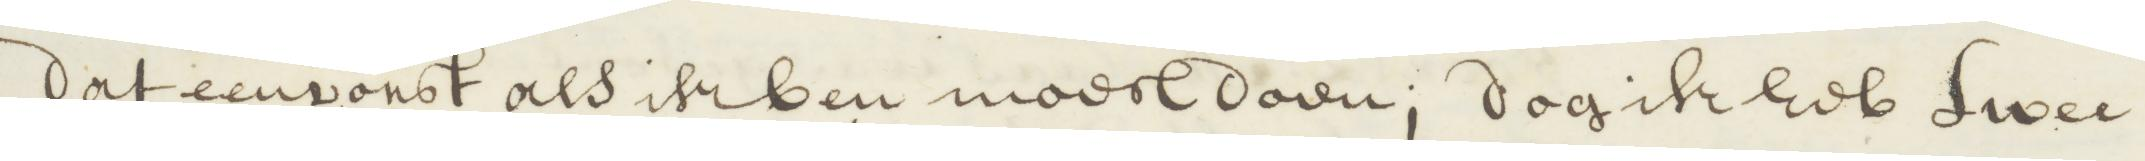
dat een vorst als ik ben moest doen; dog ik heb twee
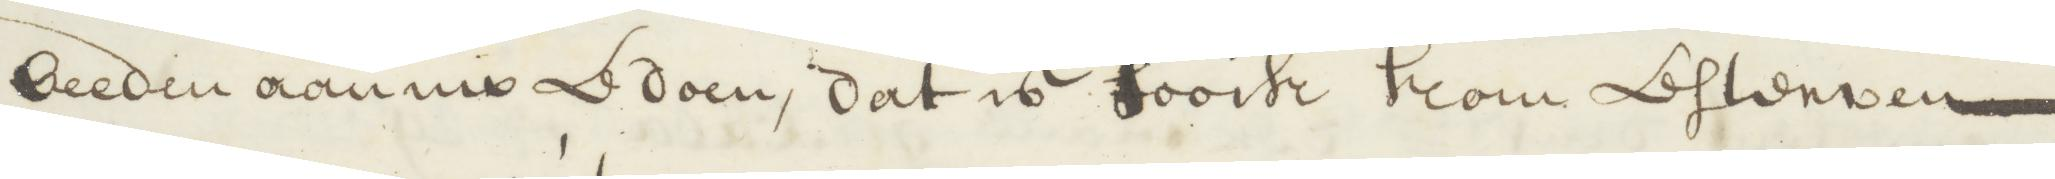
beeden aan uw te doen, dat is soo ik kom testerven
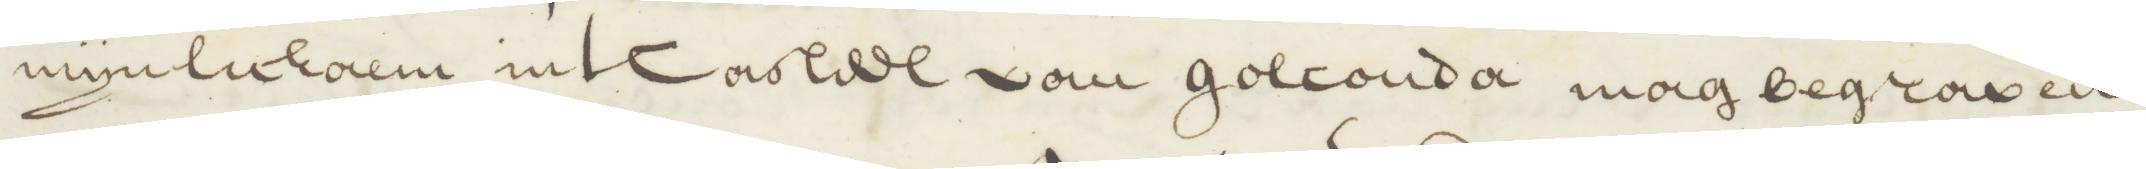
mijn lichaem in't Casteel van golconda mag begraven
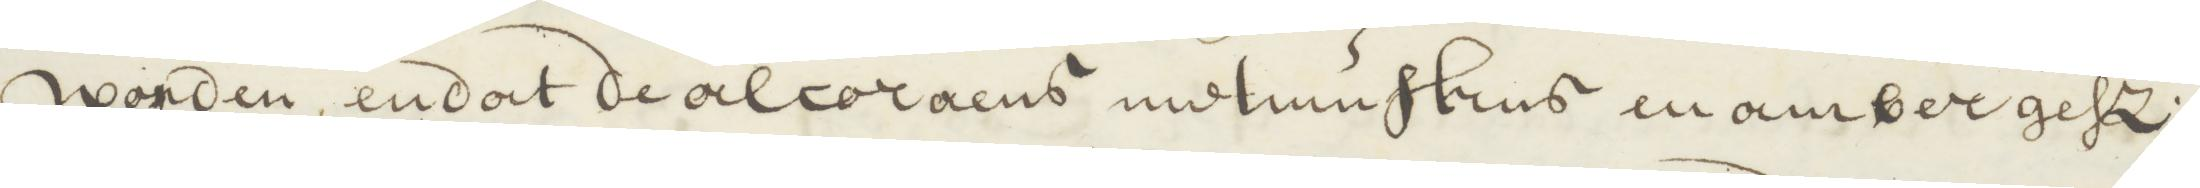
worden, en dat de alcoraens met muskus en amber gesz:
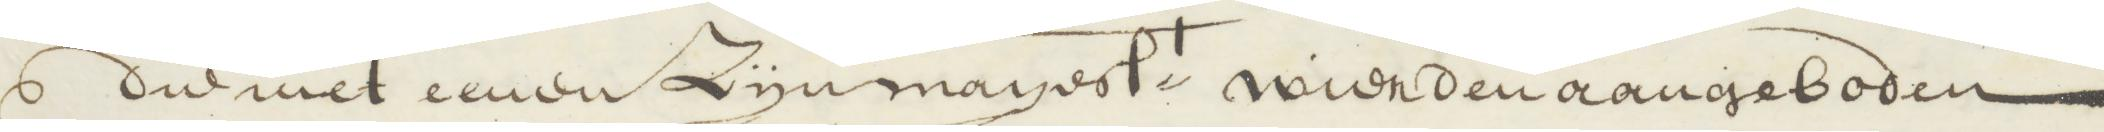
die met eenen Zijn maijest=t wierden aangeboden
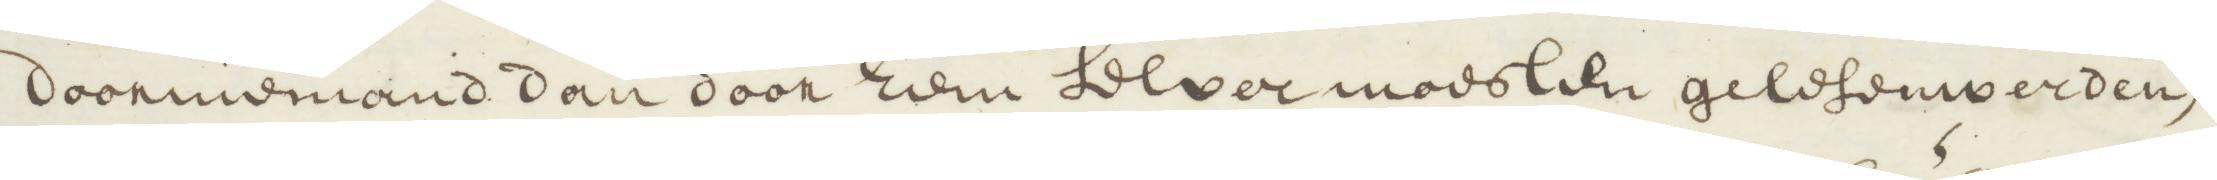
door niemand dan door hem selver moesten gelesen werden,
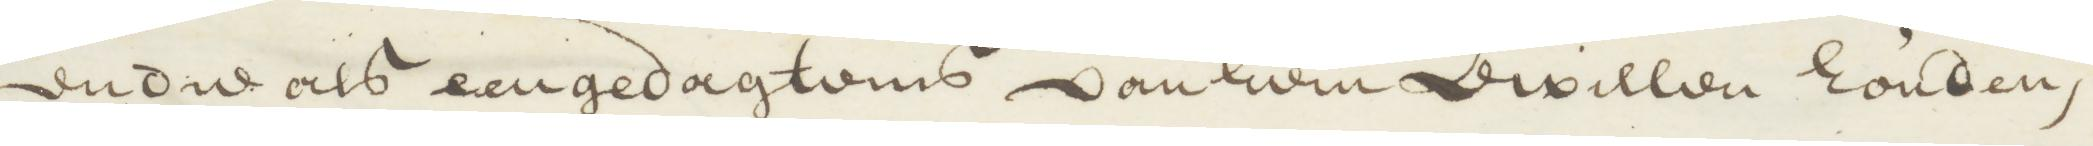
en die als een gedagtens van hem tewillen houden,
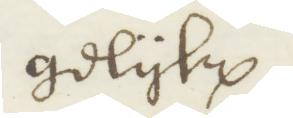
gelijkx
